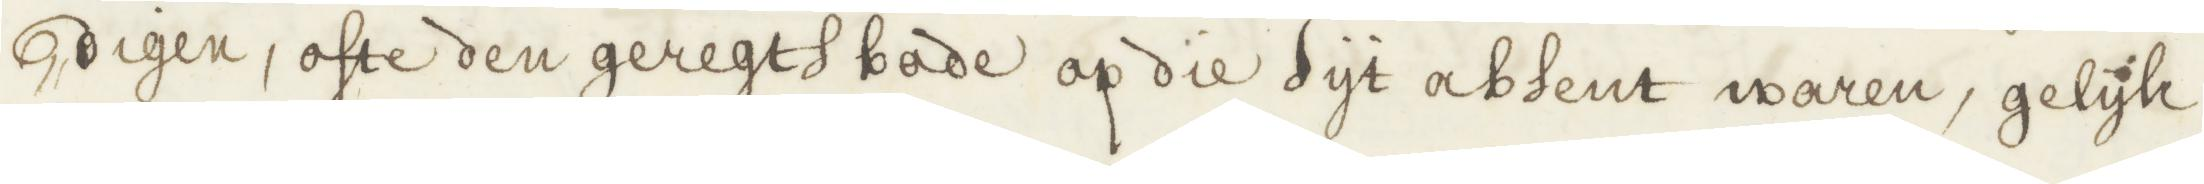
„diger, ofte den geregts bode op die tijt absent waren, gelijk
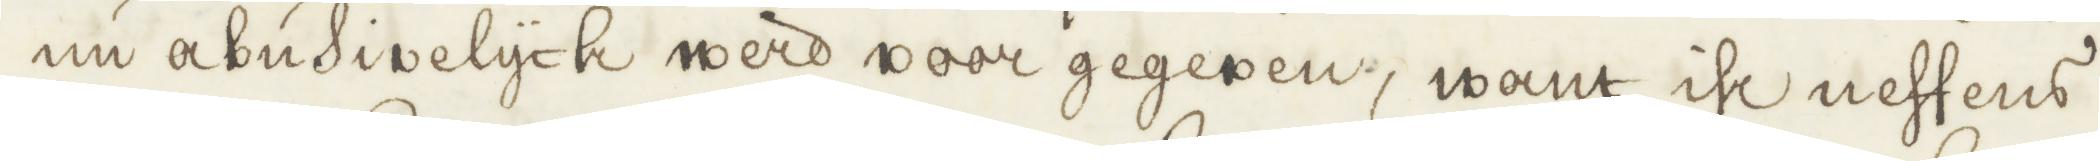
nu abusivelijck werd voor gegeven, want ik neffens
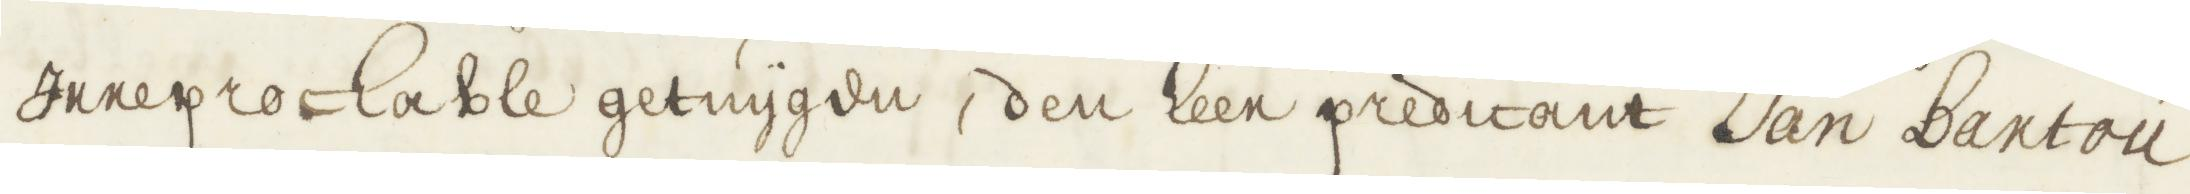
Jrrprochable getuijgen, den heer predicant Jan Bartou
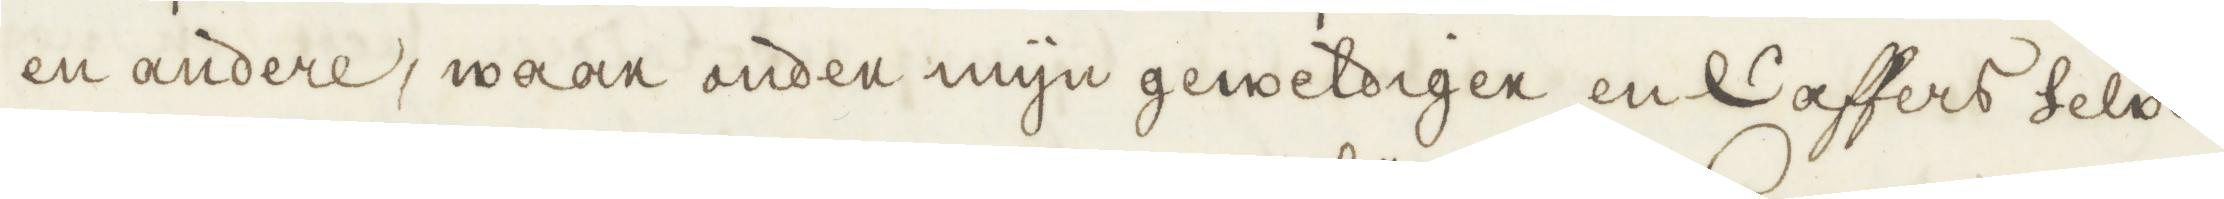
en andere, waar onder mijn geweldiger en Caffers selve
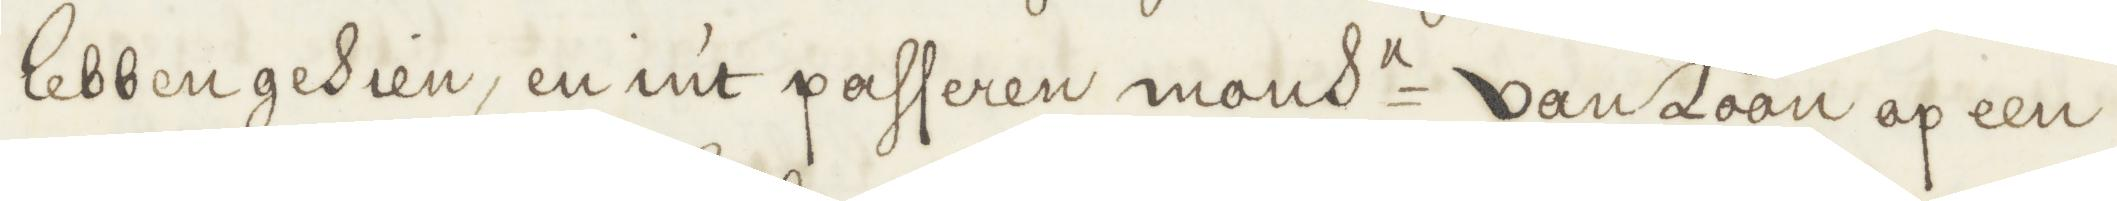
hebben gesien, en in't passeren monS=r van Loon op een
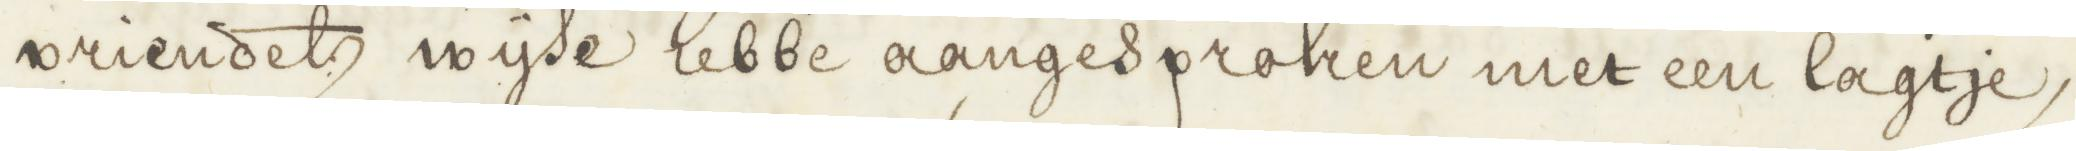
vriendelijk wijse hebbe aangesproken met een lagtje,
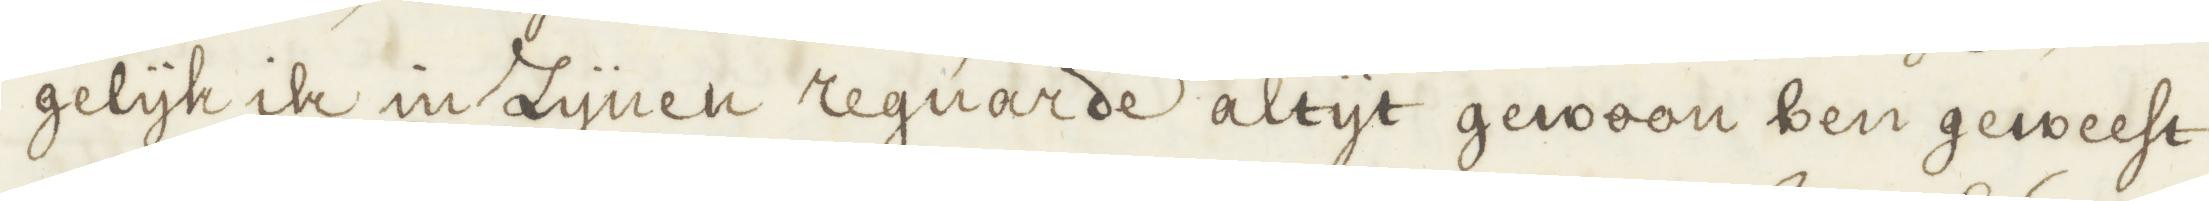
gelijk ik in zijnen reguarde altijt gewoon ben geweest
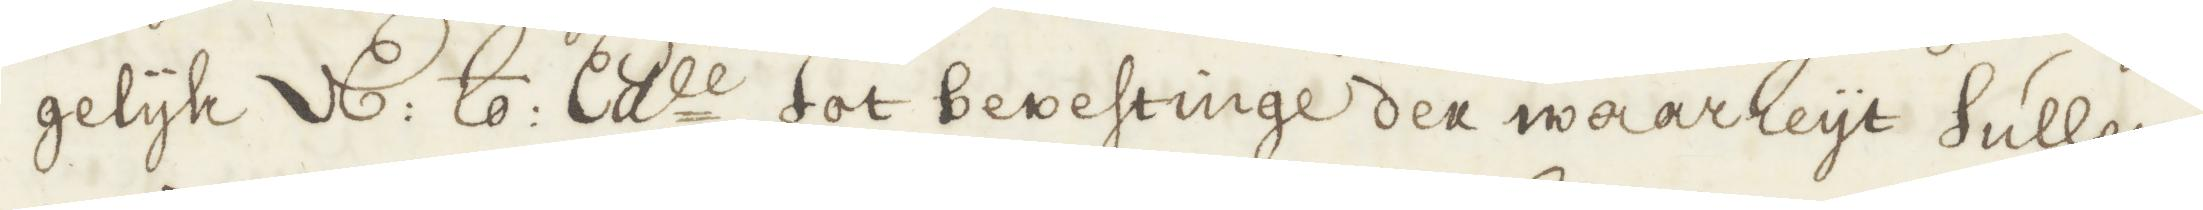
gelijk VE: Ho: Ed=le tot bevestinge der waarheijt sullen
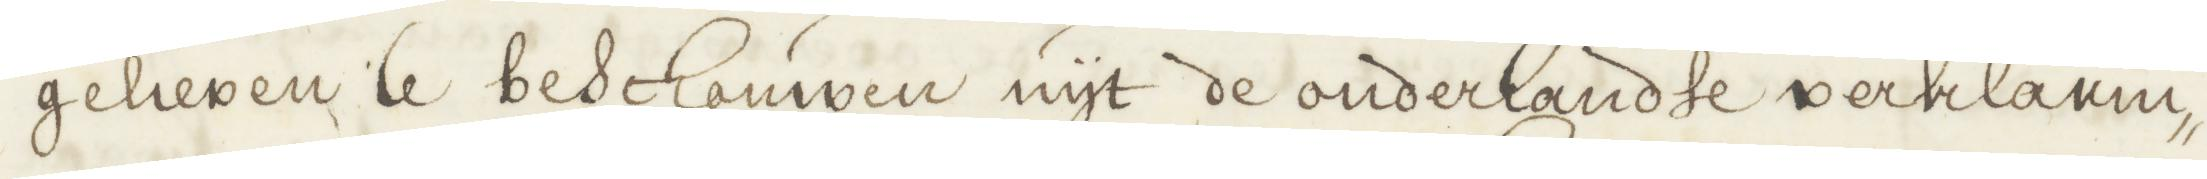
gelieven te beschouwen uijt de onderhandse verklarin„
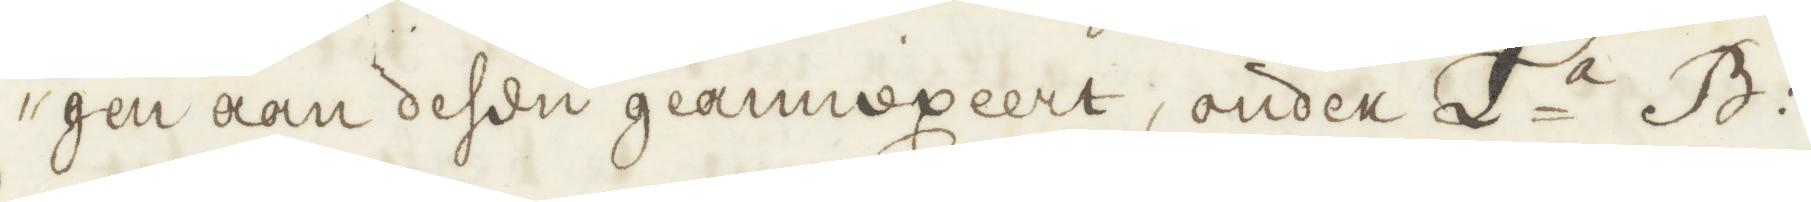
„gen aan desen geannexeert, onder L=a B:
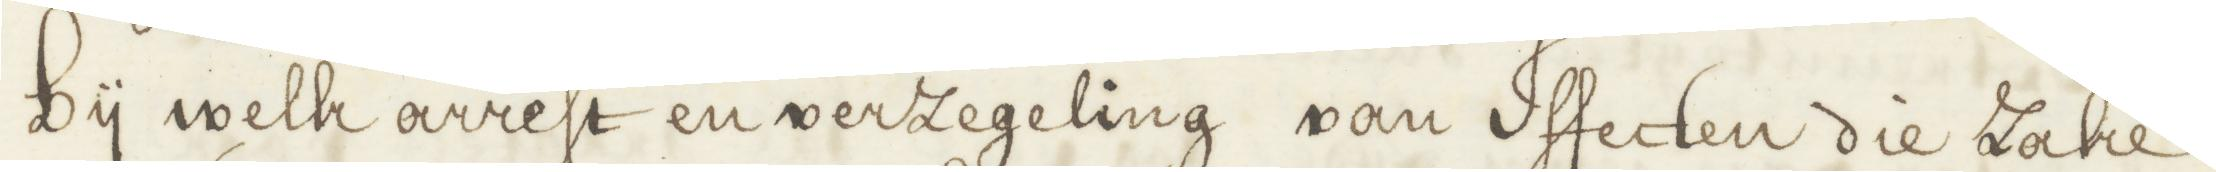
bij welk arrest en verzegeling van Effecten die zake
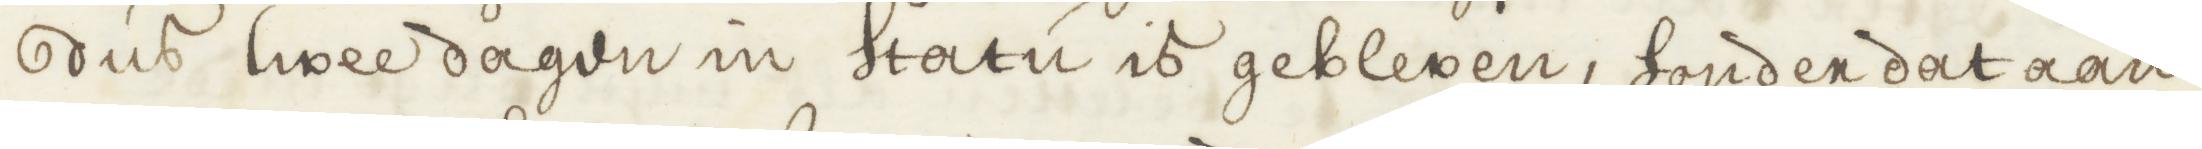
dus twee dagen in statu is gebleven, sonder dat aan
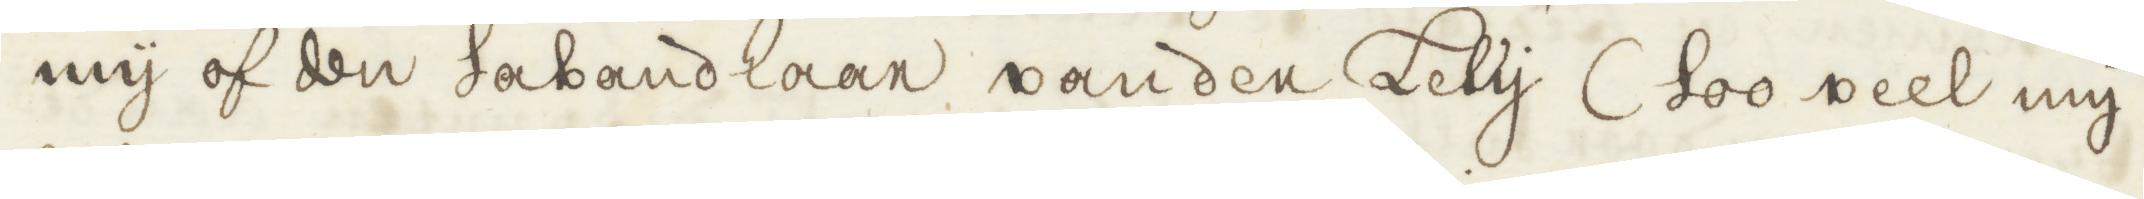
mij of den sabandhaar van der Lelij (soo veel mij
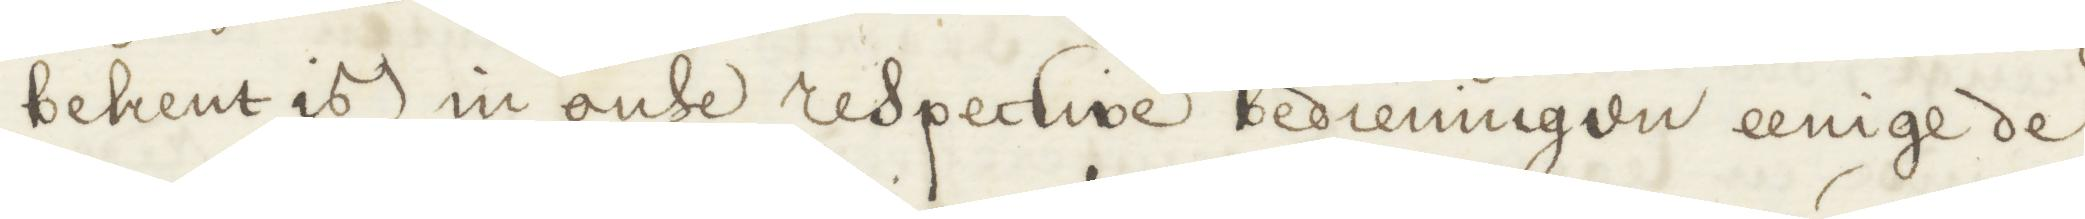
bekent is) in onse respective bedieningen eenige de
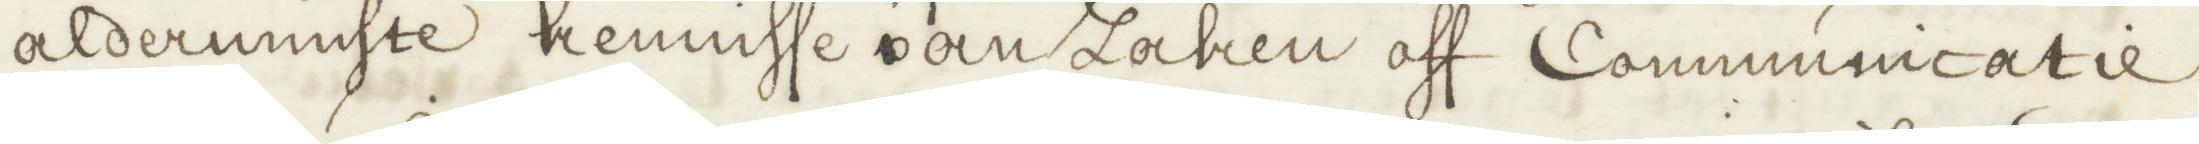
alderminste kennisse van zaken off Communicatie
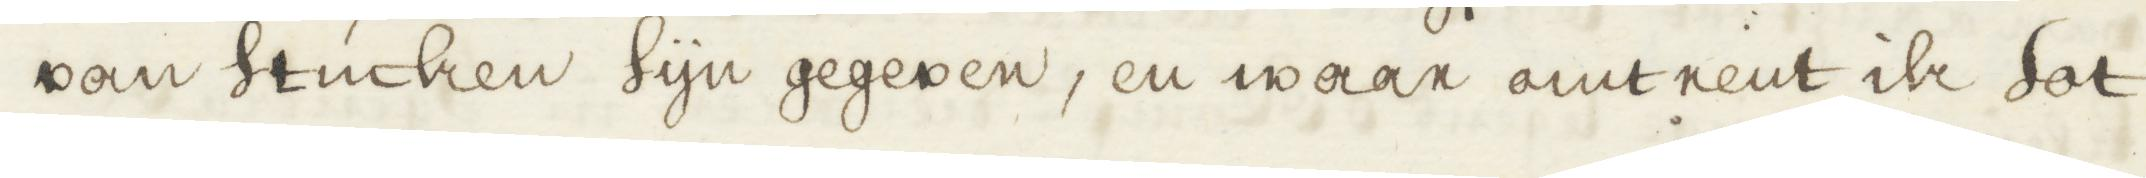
van stucken sijn gegeven, en waar omtrent ik tot
